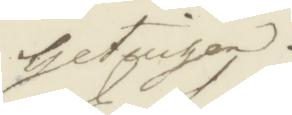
Getuigen.
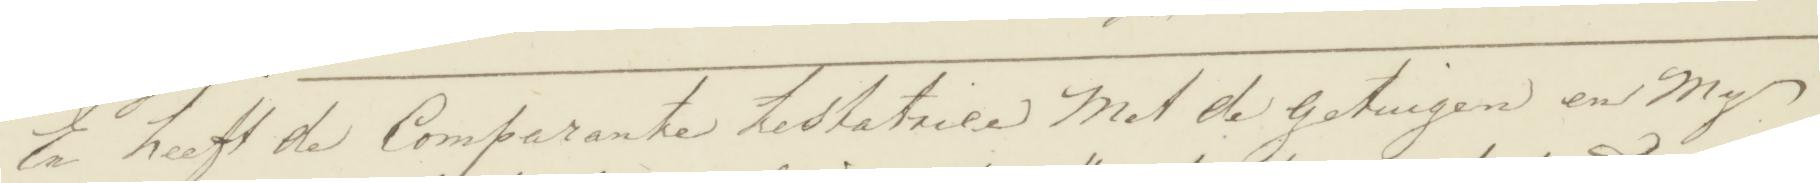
en heeft de Comparanten testatrice Met de getuigen en My
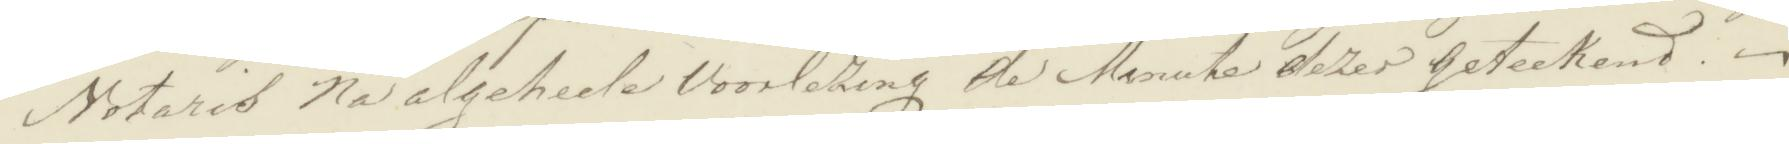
Notaris Na algeheele Voorlezing de Minute dezer geteekend. —
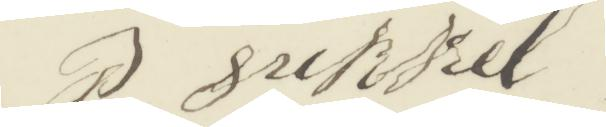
P sukkel
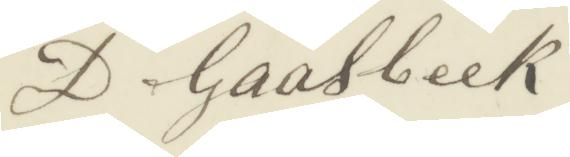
D: Gaasbeek
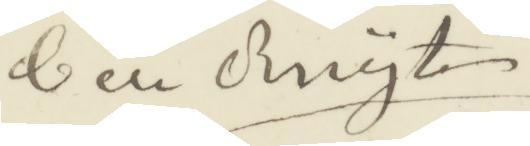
C de Ruijter
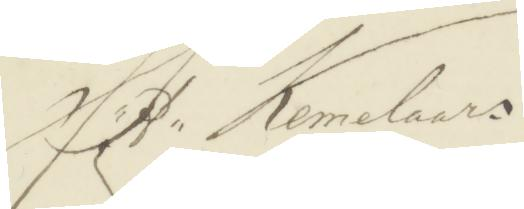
J. H. Kemelaar .\
